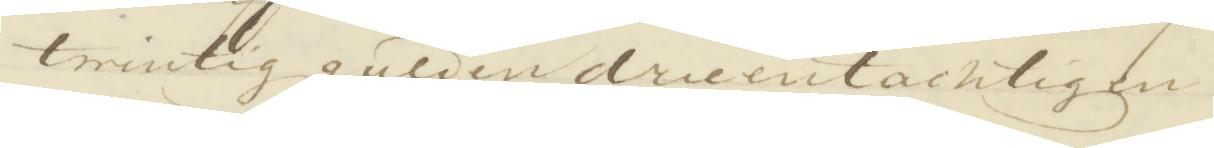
twintig gulden drie entachtig en
